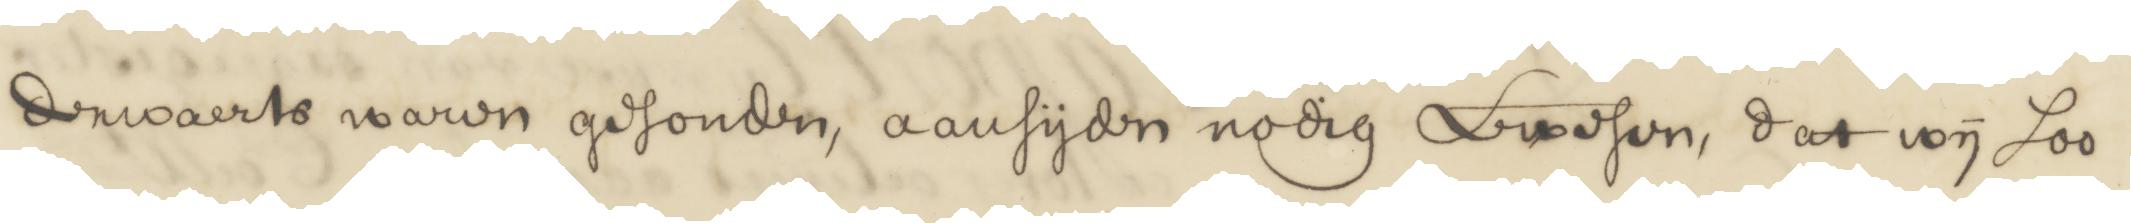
derwaerts waren gesonden, aansijden nodig tewesen, dat wij soo
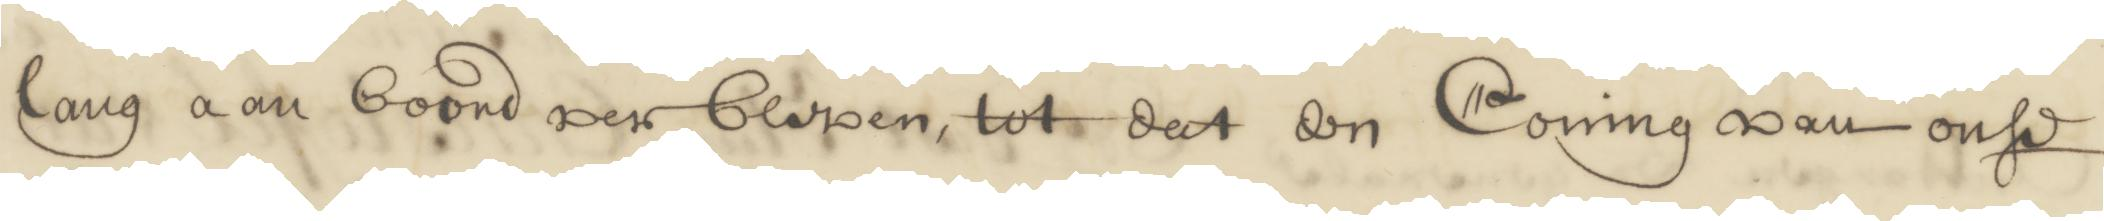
lang aan boord verbleven, tot dat den Coning van onse
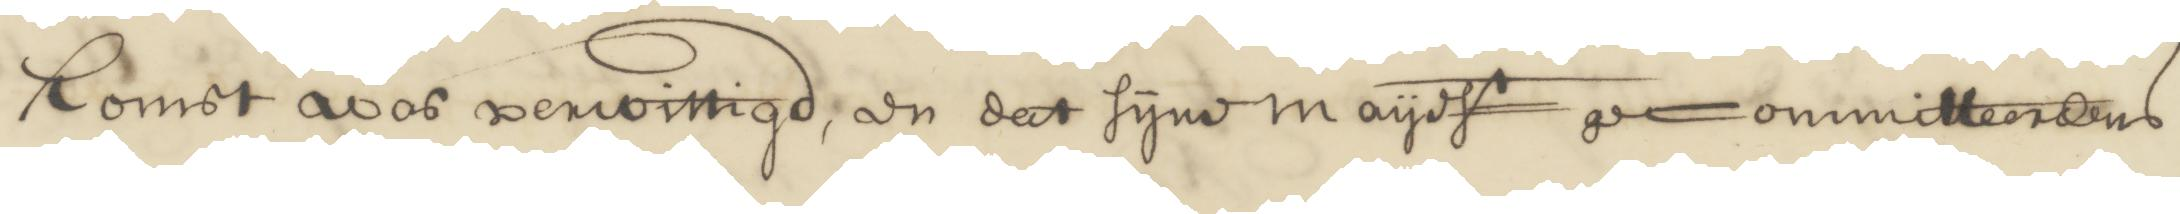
komst was verwittigd, en dat sijne maijes=t gecommitteerdens
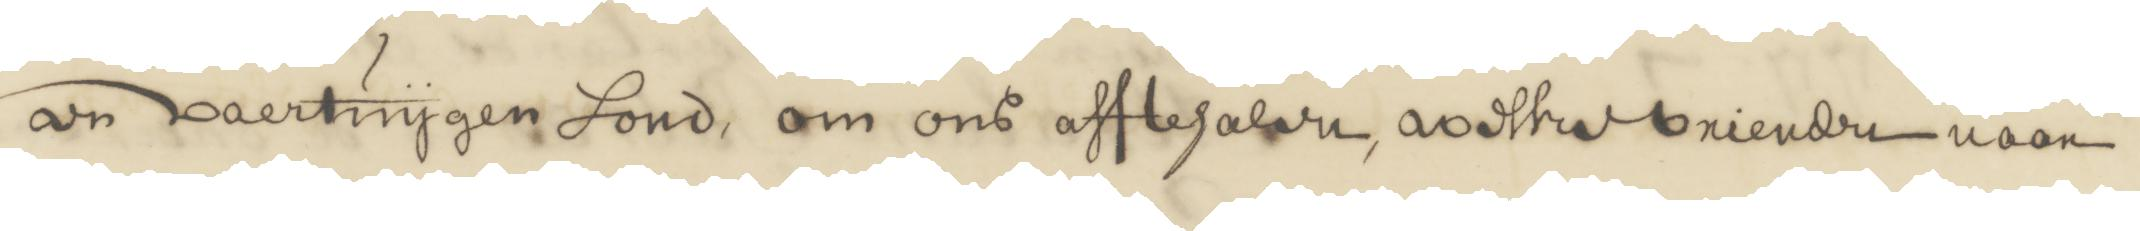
en vaertuijgen sond, om ons afftehalen, welke vrienden naar
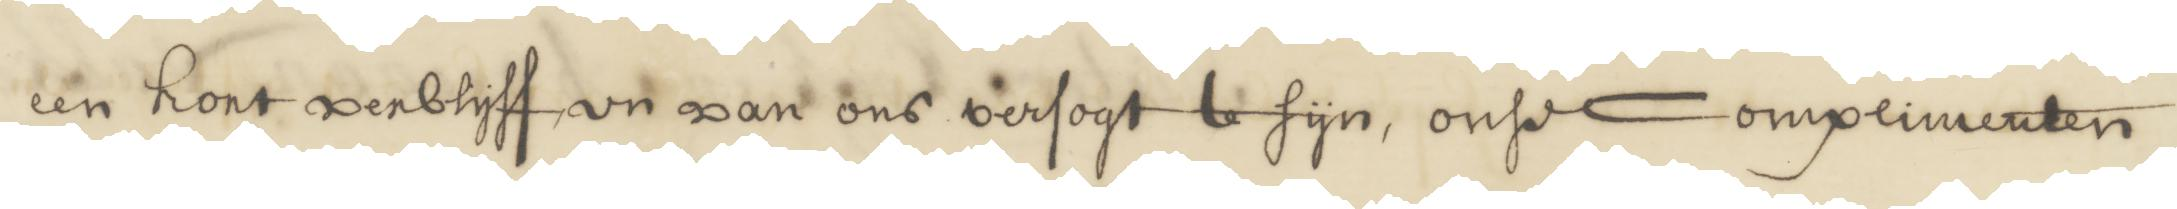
een kort verblijff, en van ons versogt te sijn, onse complimenten
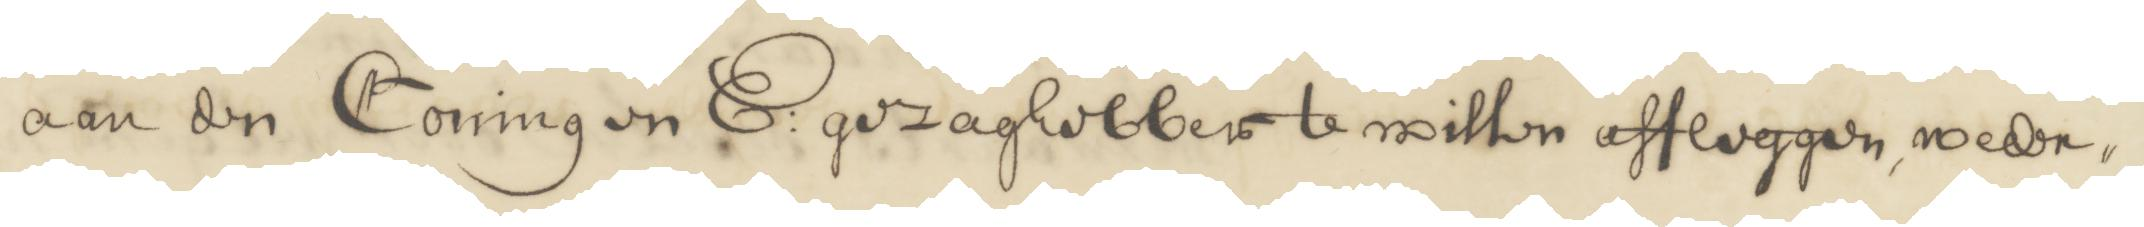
aan den Coning en E: gezaghebber te willen affleggen, weder„
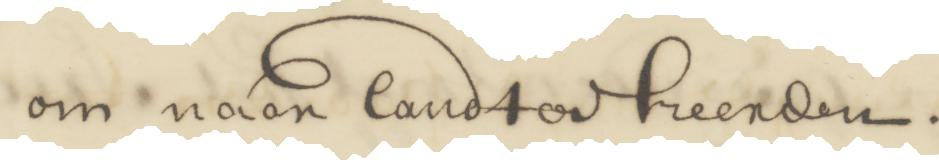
om naer landtoe keerden.
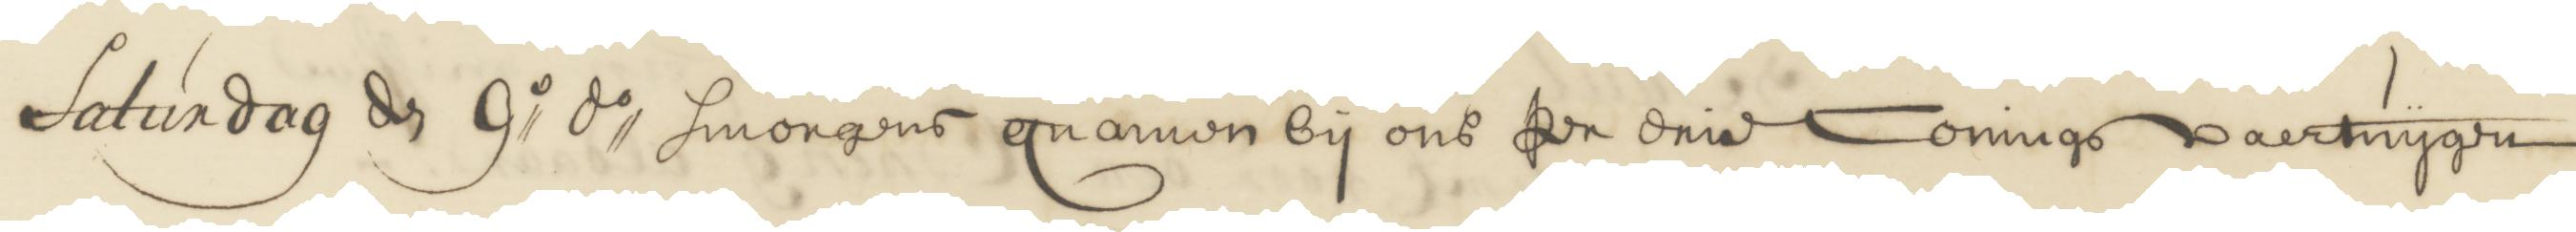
Saturdag den 9„e d„o smorgens quamen bij ons per drie coningsvaertuijgen
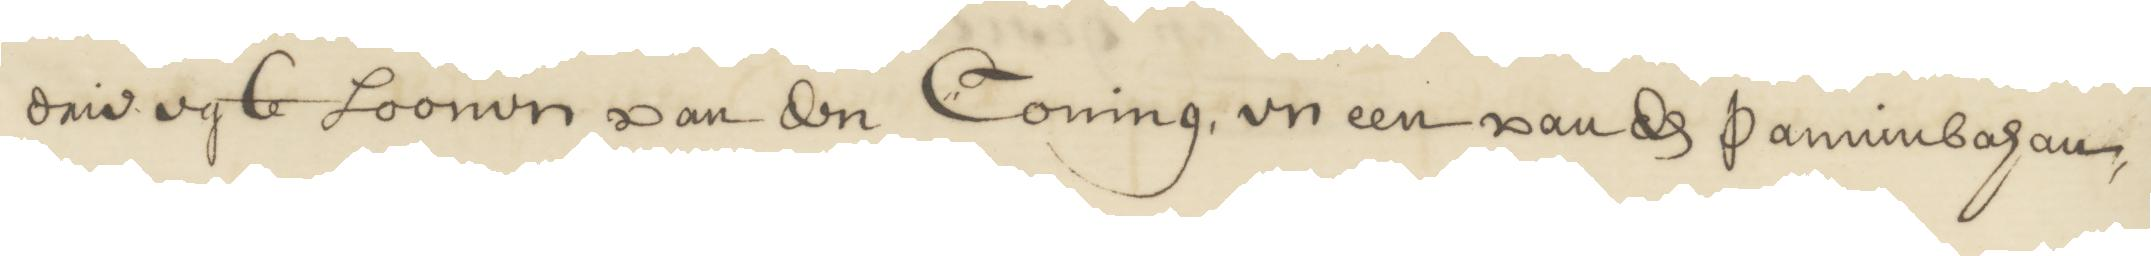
drie egte soonen van den Coning, en een van den panninbahan,
